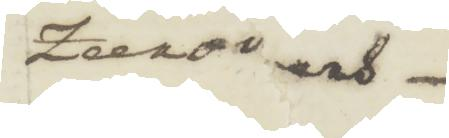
zeerovers-
